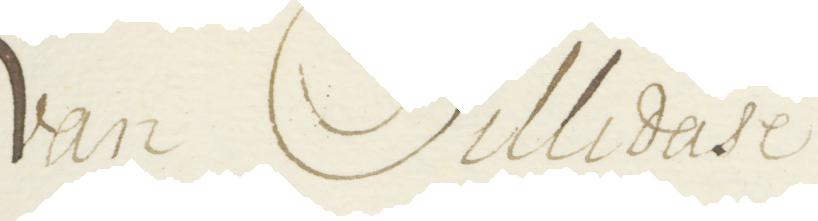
van Sillidase
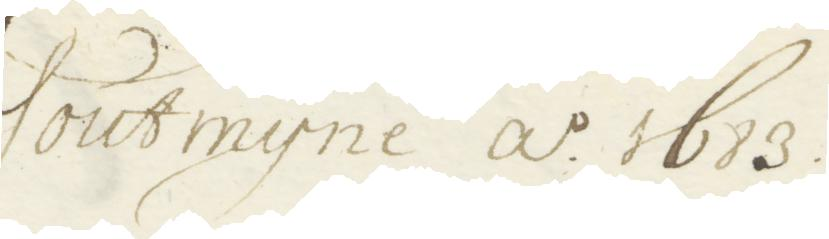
Goutmyne a:o 1683.
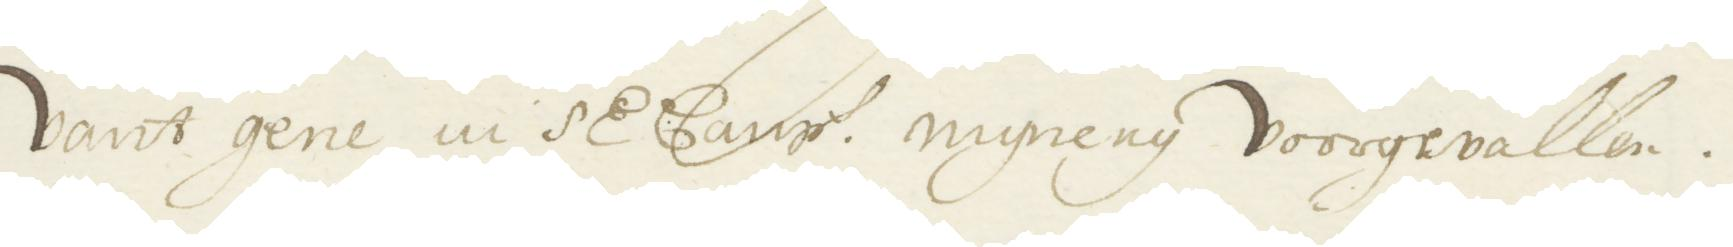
van ’t gene in sE Camp.s mynery voorgevallen.
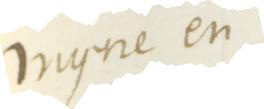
mijne en
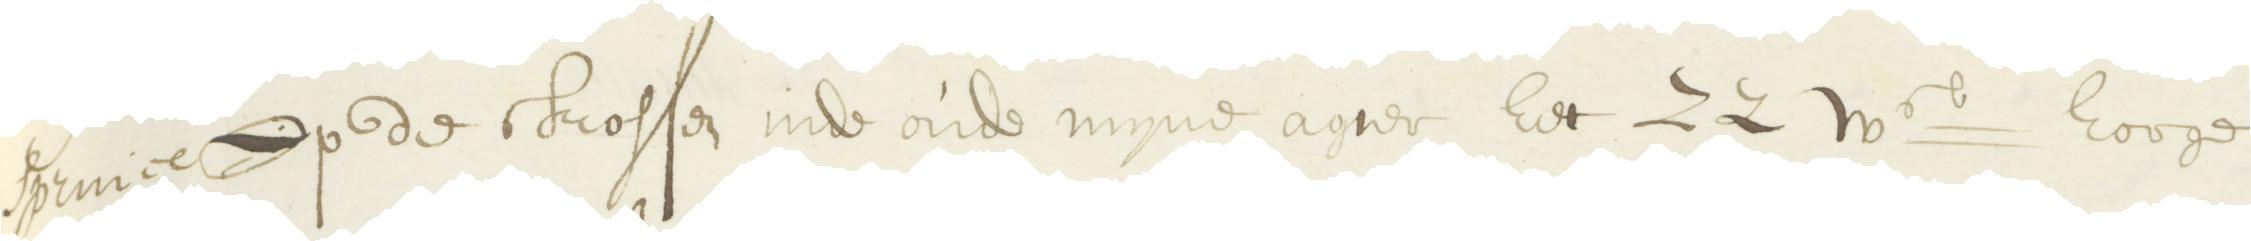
Sprince Op de strossen inde oude myne agter het ZZ.W:st hooge
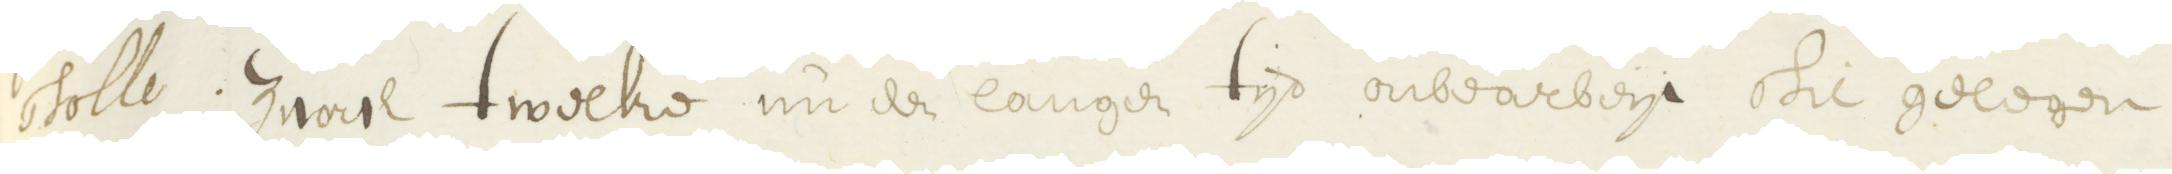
,Solle Zwarth twelke nu den langen tijd onbearbeijt stil gelegen
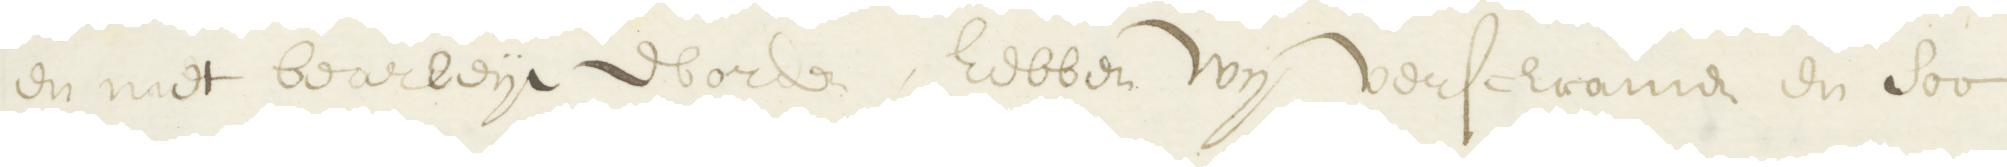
en niet bearbeijt worden, hebben wy verschramen en soo
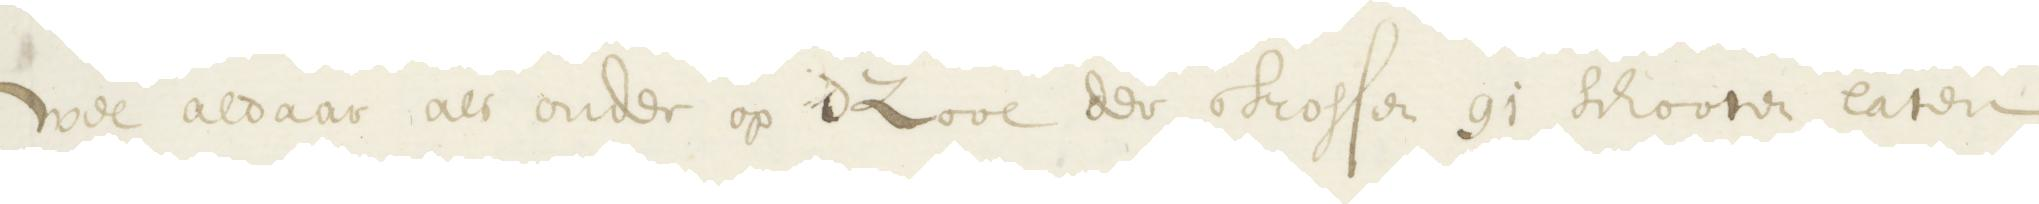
wel aldaar als onder op dzool der strossen 91 schooten laten
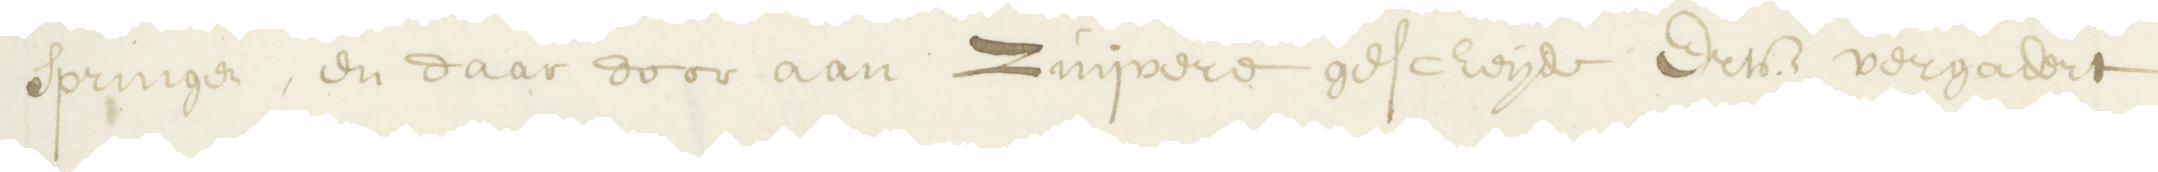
springen, en daar door aan Zuijvere gescheijde Erts: vergadert
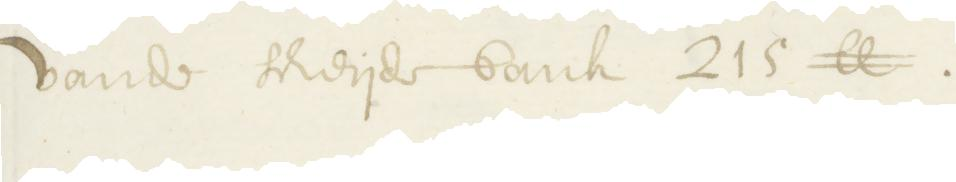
vande scheijde bank 215 lb.
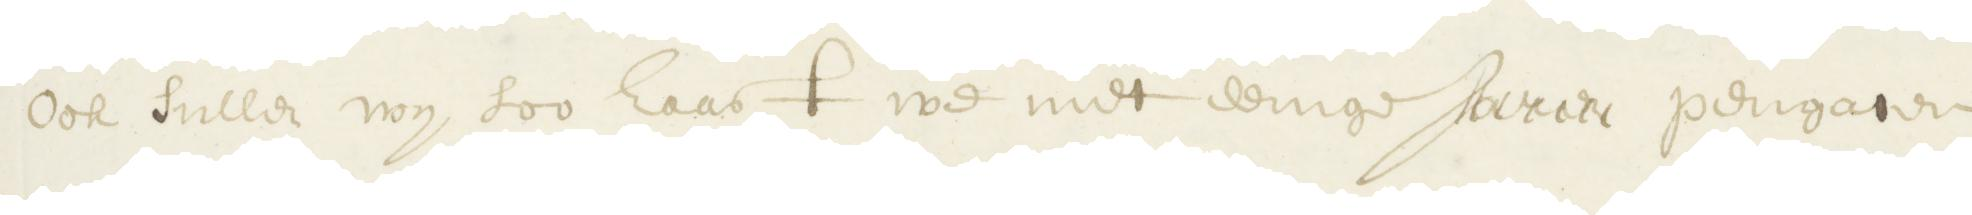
Ook sullen wy, soo haast we met eenige Jaren pengaten
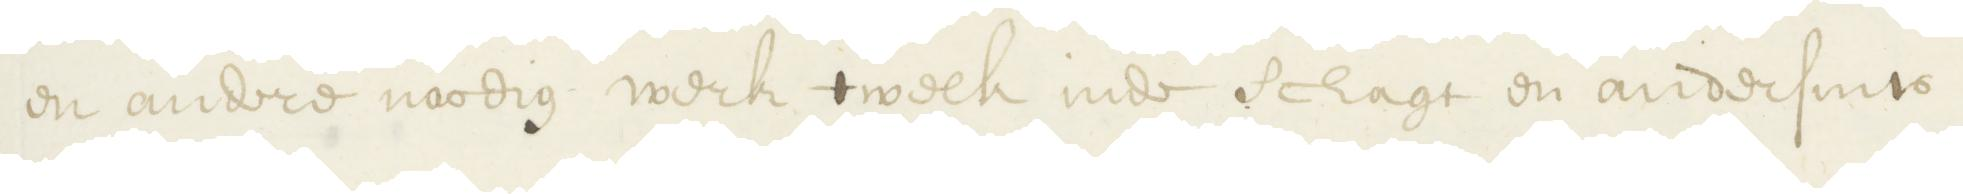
en andere noodig werk twelk inde schagt en andersints
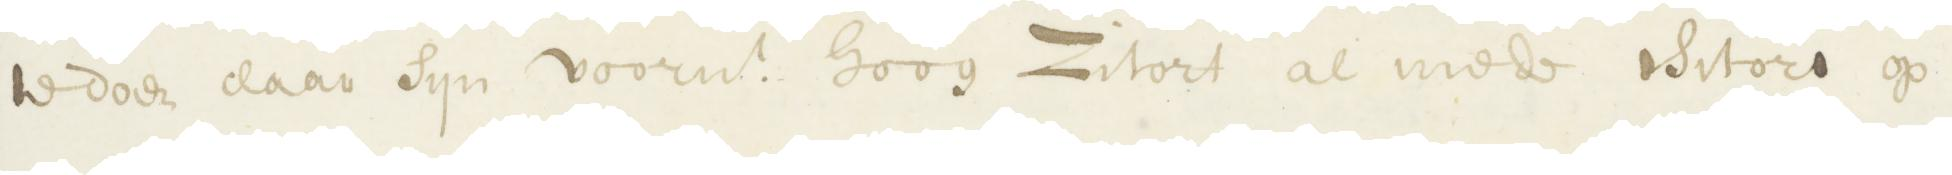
te doen daar syn voorn: hoog Zitort al mede tSitort op
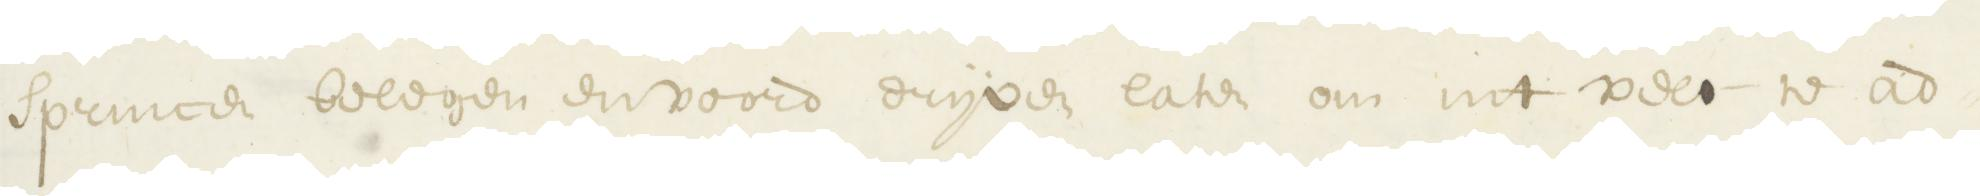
sprincen belegen en voord drijven laten om int velt te ad
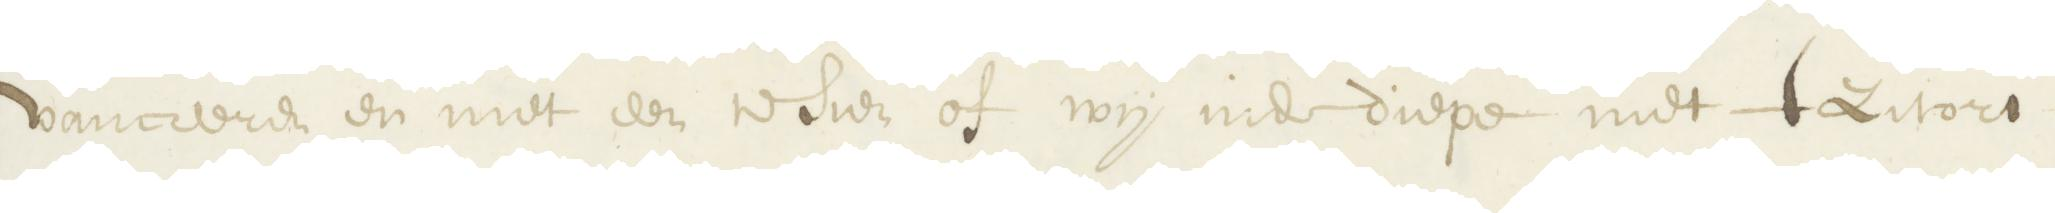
vanceeren en met een tesien of wij inde diepe met ’t Zitort
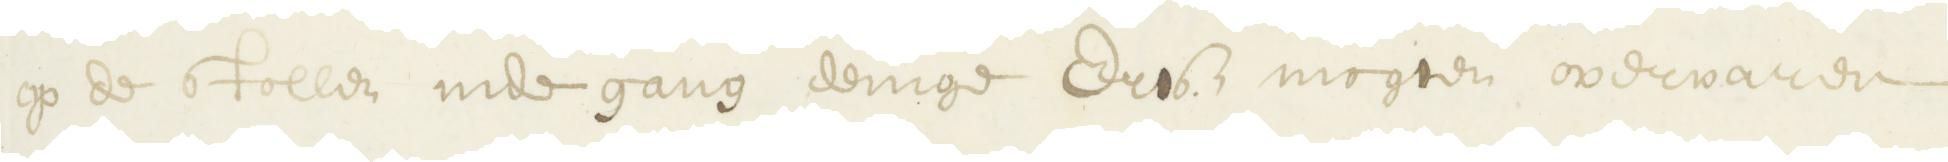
op de stollen inde gang eenige Erts: mogten overvaren
